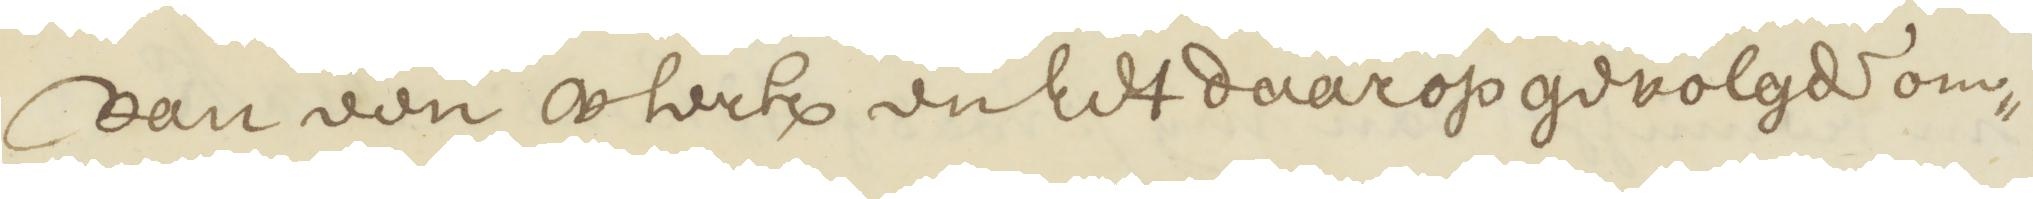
van een vlerk en het daarop gevolgde om„
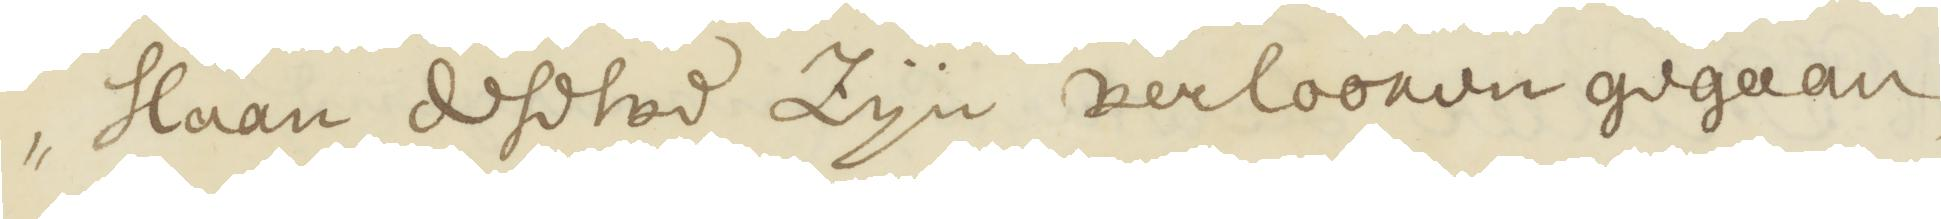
„ slaan deselve zijn verlooren gegaan,
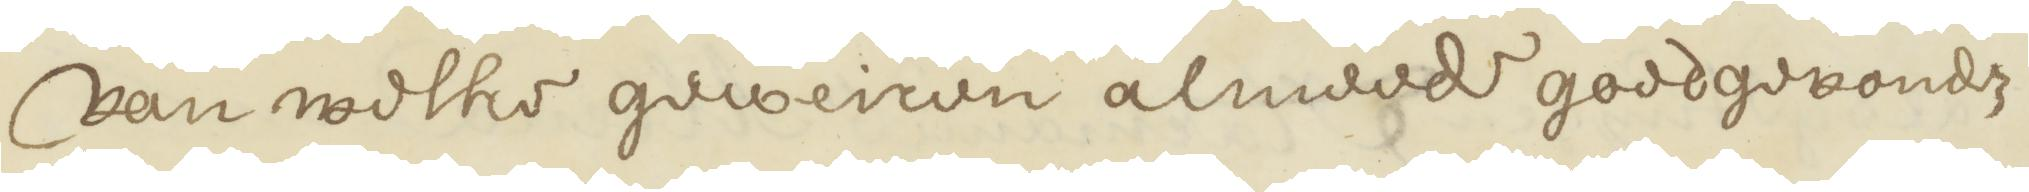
van welke geweiren almeede goedgevonden
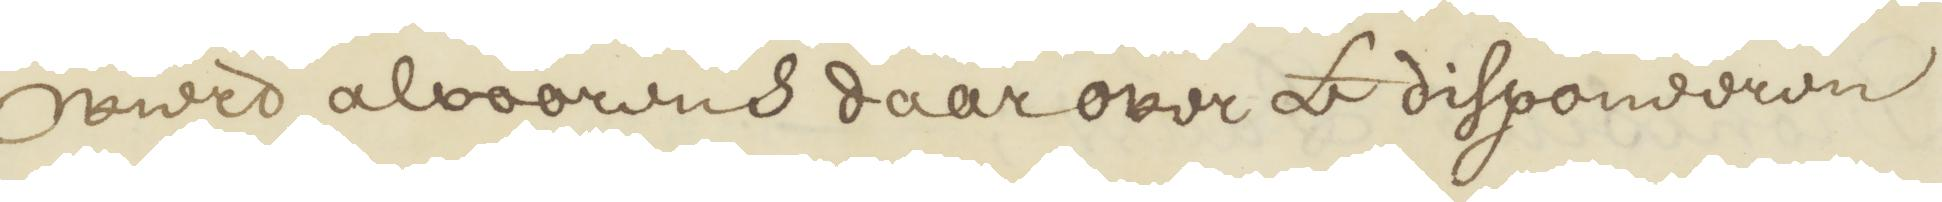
wierd alvoorens daar over te disponeeren
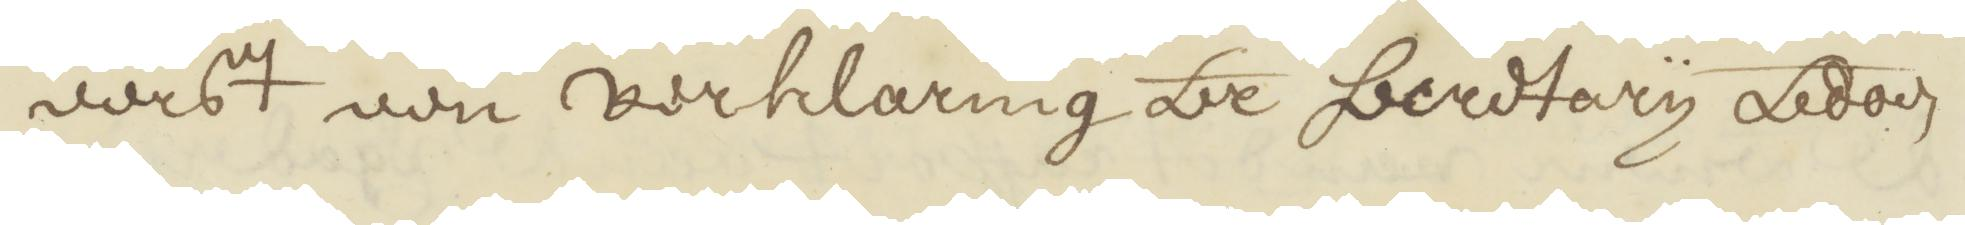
eerst een verklaring ter secretarij tedoen
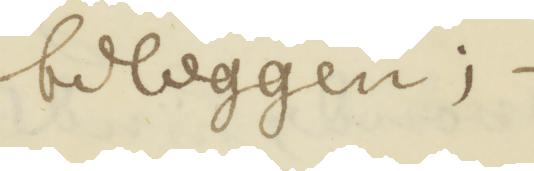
beleggen;
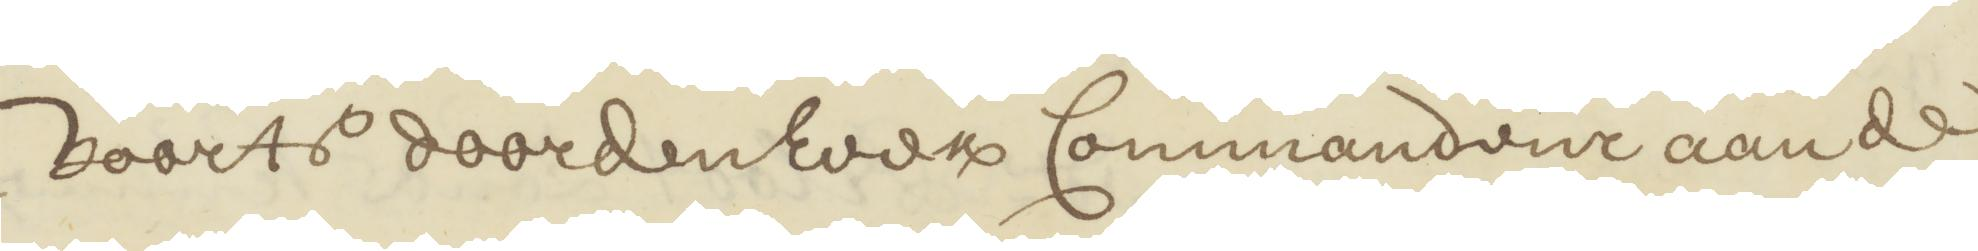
voorts doorden heer Commandeur aan de
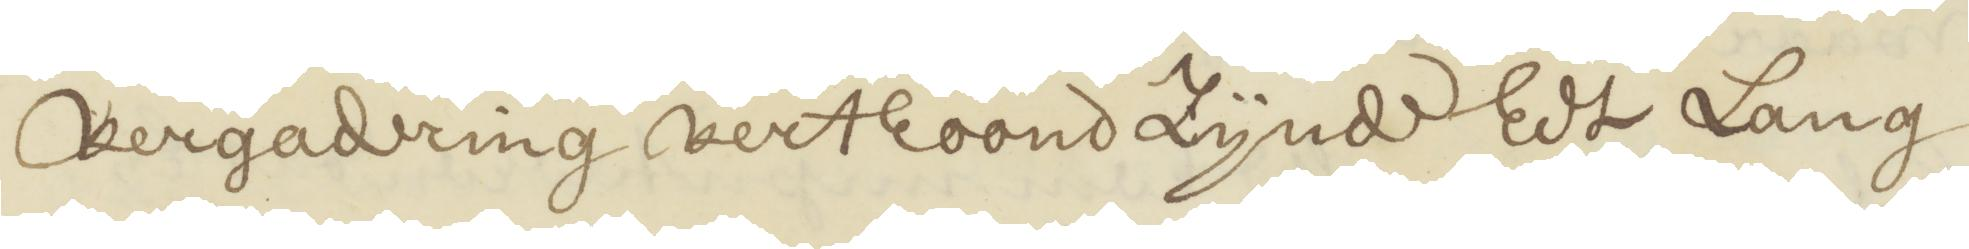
vergadering verthoond zijnde het lang
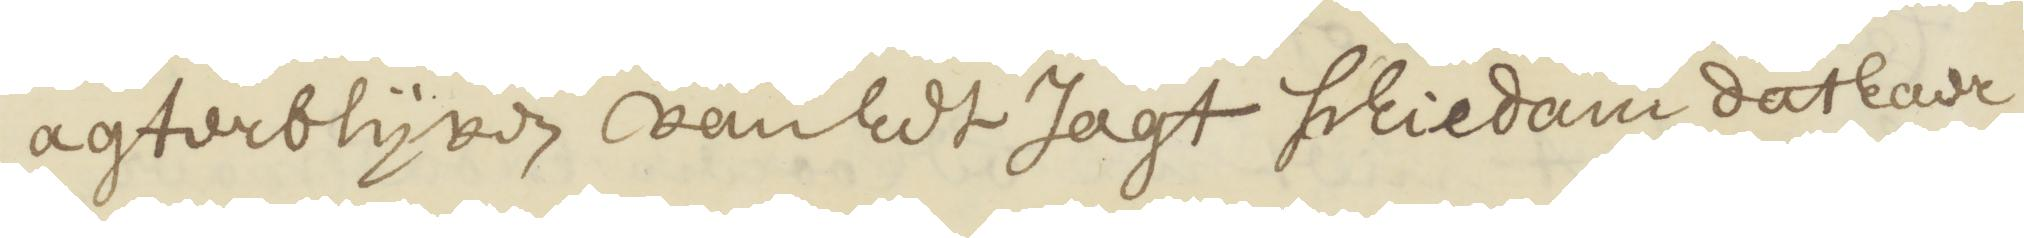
agterblijven van het jagt schiedam dat haer
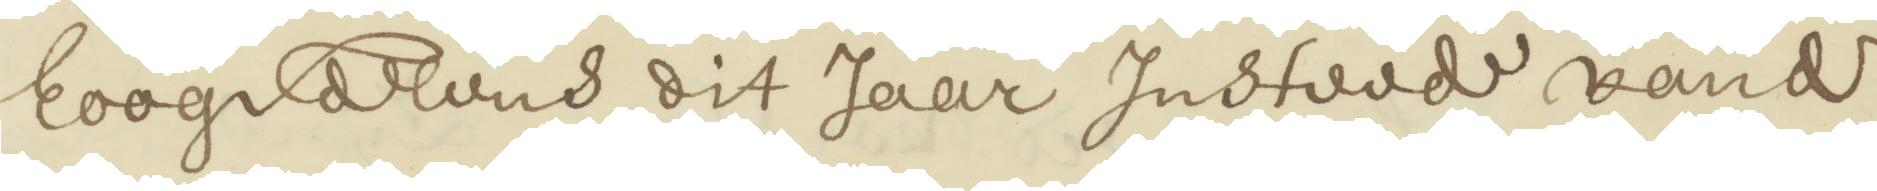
hoogEdelens dit jaar jnsteede van de
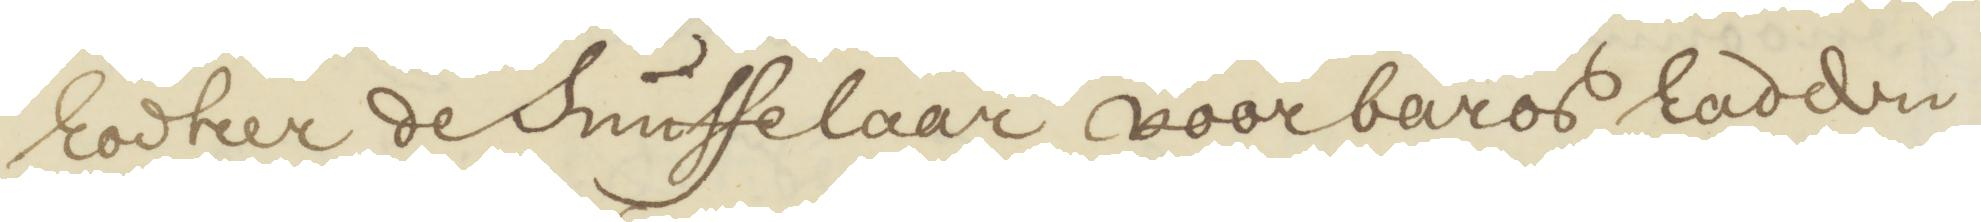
hoeker de snuffelaar voor baros hadden
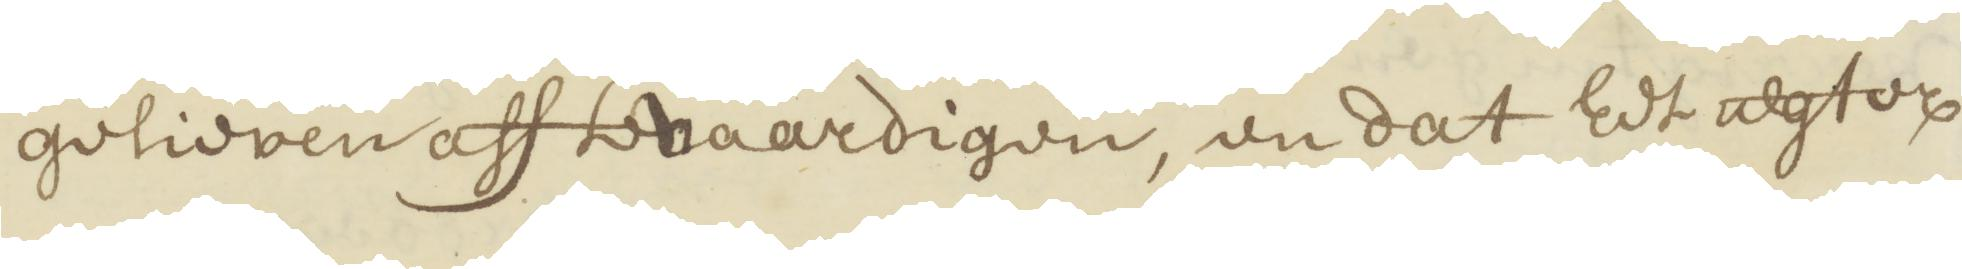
gelieven aff tevaardigen, en dat het egter
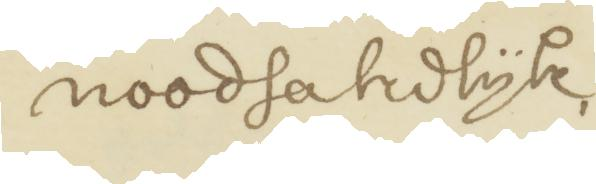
noodsakelijk,
